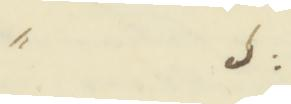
„ 5:
